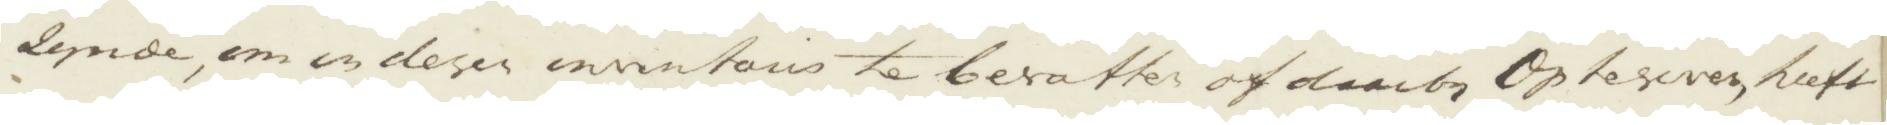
zynde, om in dezen inventaris te bevatten of daarby Op te geven heeft
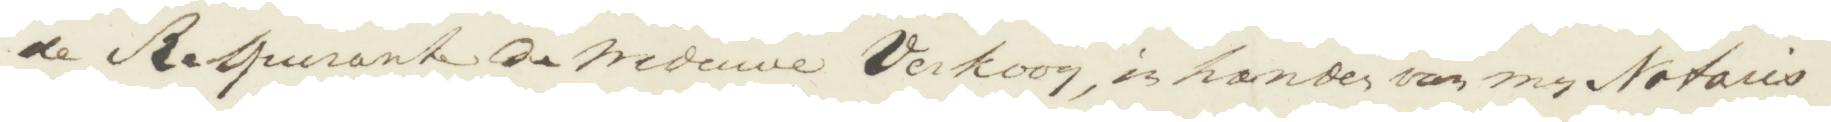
de Requirante de weduwe Verhoog, in handen van my Notaris
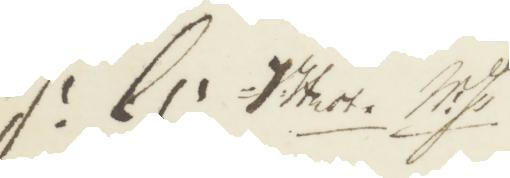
J: G: =W:snot. W: S
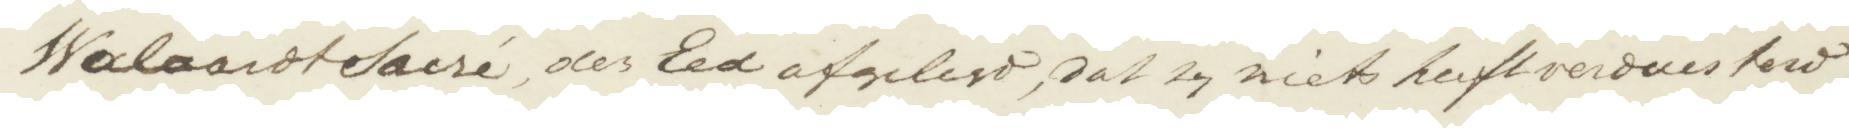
Walaardt Sacré, den Eed afgelegd, dat zij niet heeft verduisterd
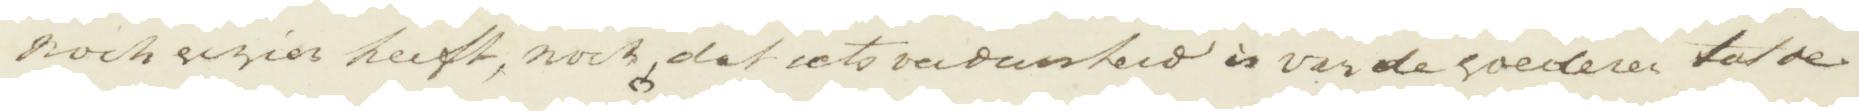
noch gezien heeft, noch ¶ dat iets verduisterd is van de goederen tot de
